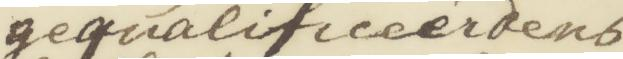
gequalificeerdens
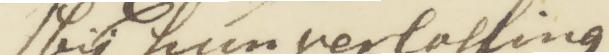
bij hun verlossing
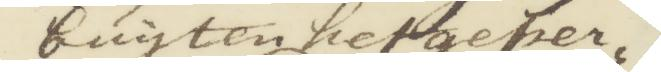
buijten het geper„
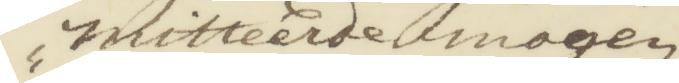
„mitteerde mogen
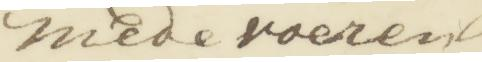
mede voeren
